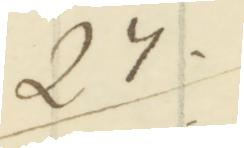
27./.
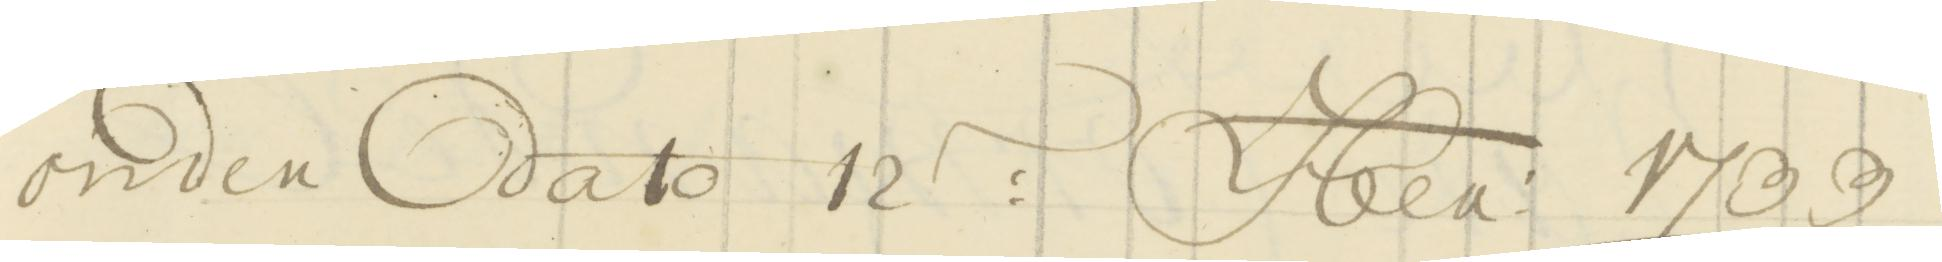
onder dato 12:' Jber: 1733
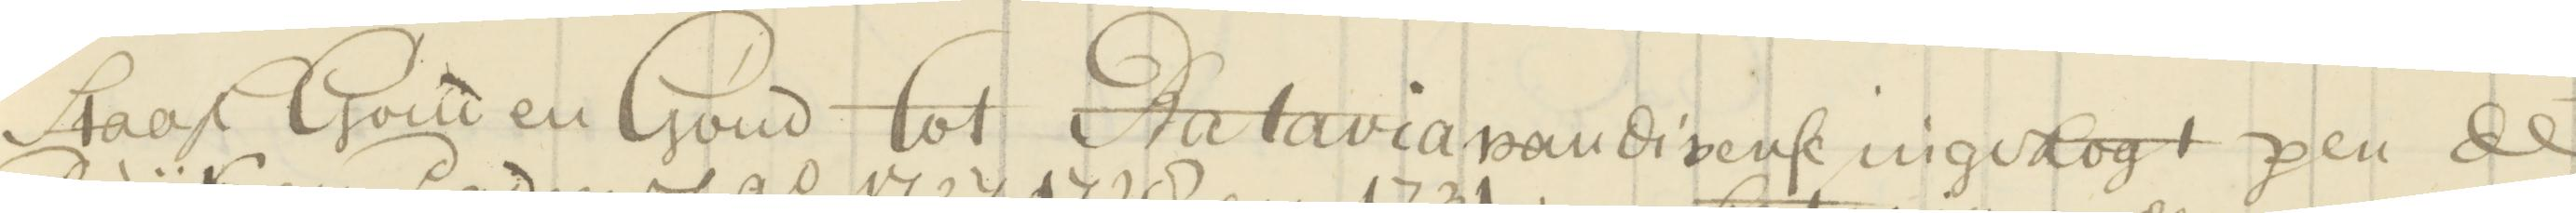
Staaf Goud en Goud tot Batavia van diverse ingekogt per de
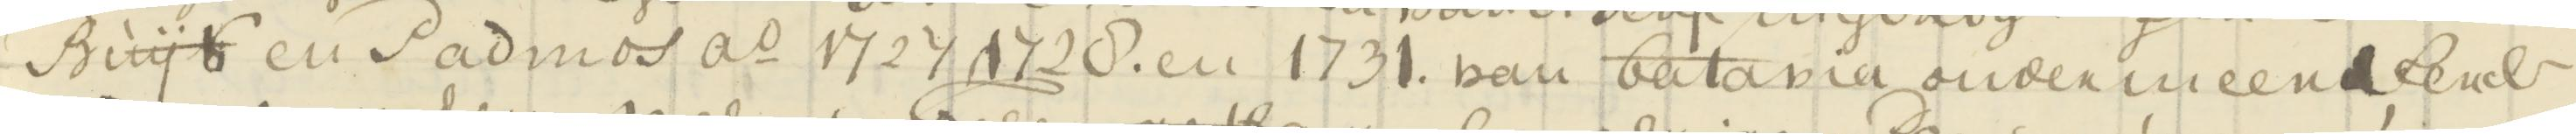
Buijs en Padmos a_o 1727 1728. en 1731. van batavia onder meer Eerde
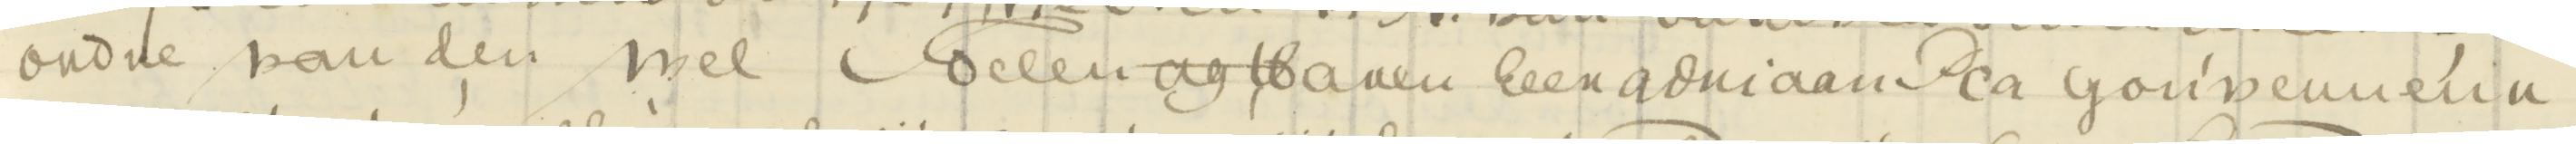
ordre van den wel Edelen agtbaren heer adriaan Pla gouverneur
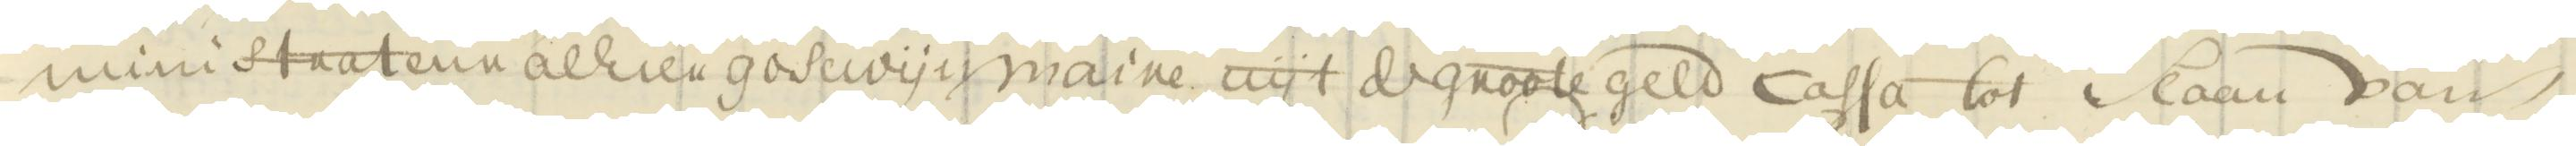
ministrateur alhier gosewijn maire uijt de groote geld cassa tot slaan van
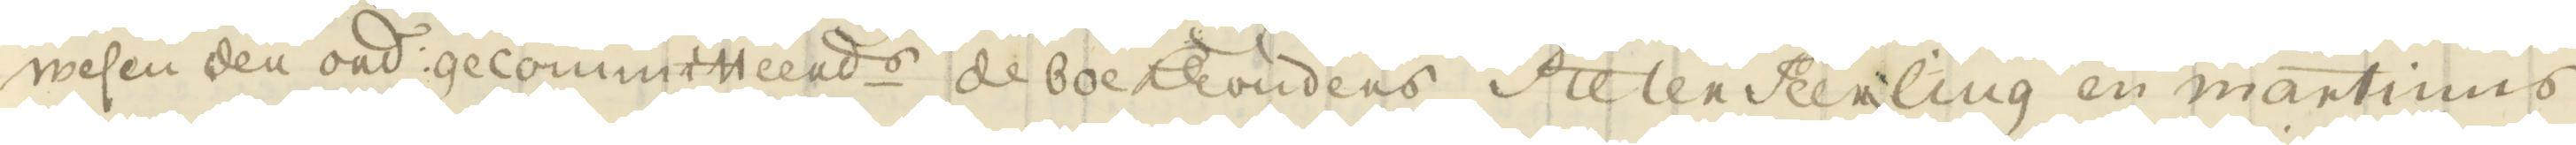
wesen der ord: gecommitteerds de boekhouders Pieter Teerling en martinus
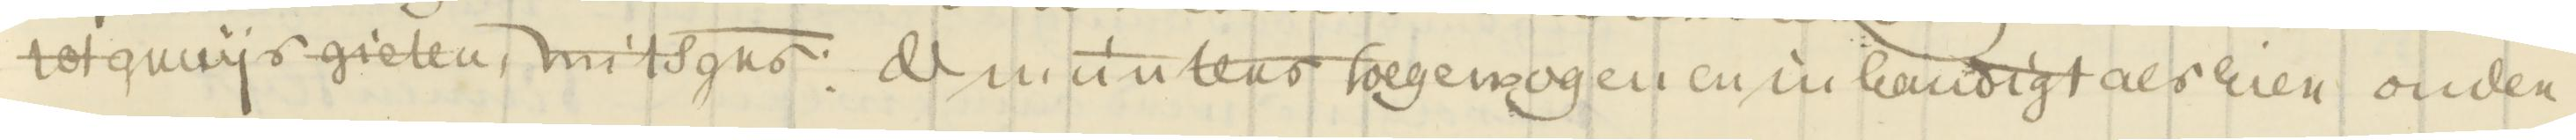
tot qruijs gieten, mitsgrs: de munters toegewogen en in handigt als hier onder
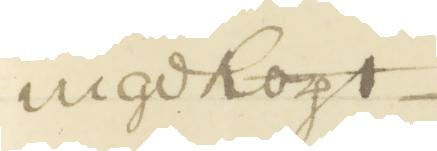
ingekogt
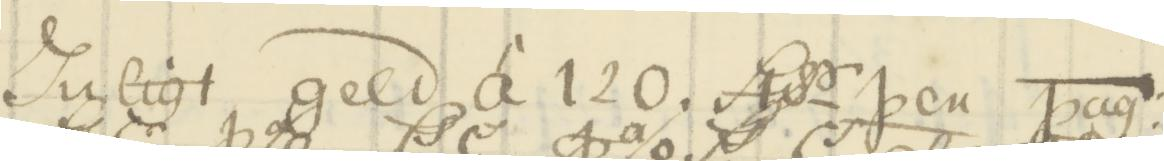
In ligt geld â 120. Stver=s per pag
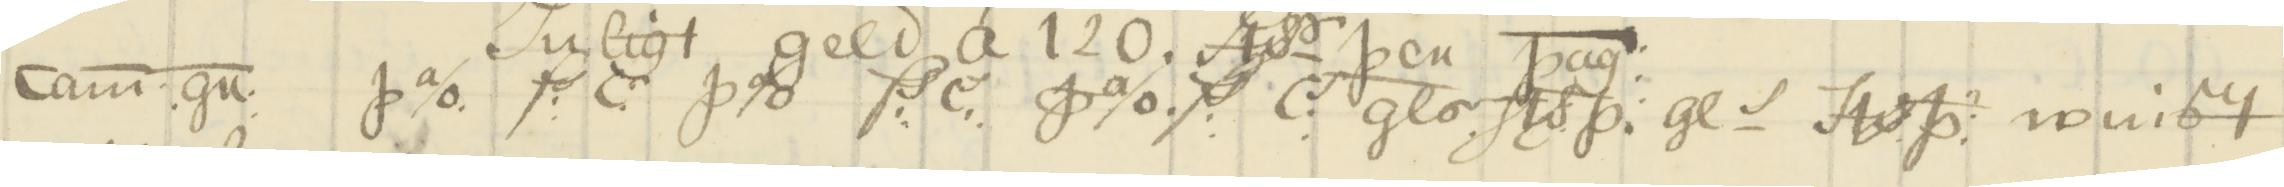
cam: gr: p a/o f:s c.s p a/o f:s c:s p a/o f:s c:s gls. stver p: gl_s stver p:' winst
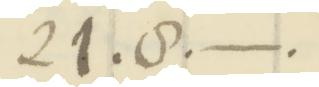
21.8.—.
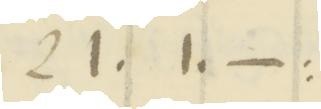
21. 1.—
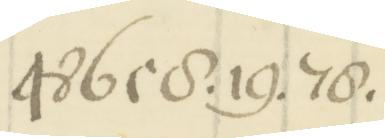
48658:19. 78.
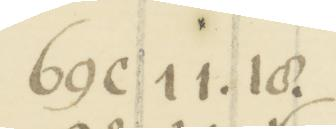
695 11.18.
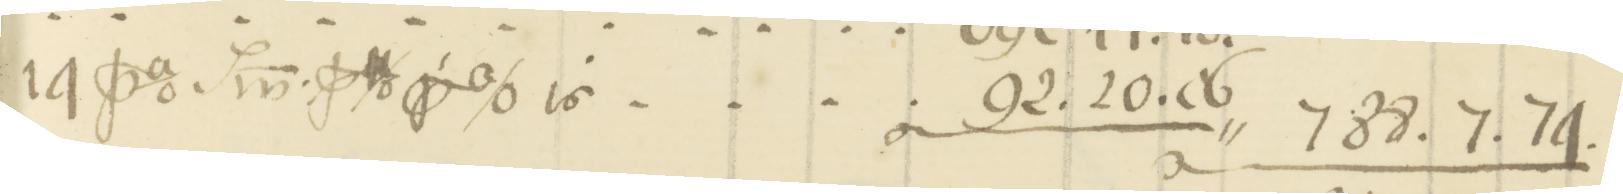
14 p a/o Sw: p a/o p' a/o is - - - - 92. 20.56„ 788. 7. 74
